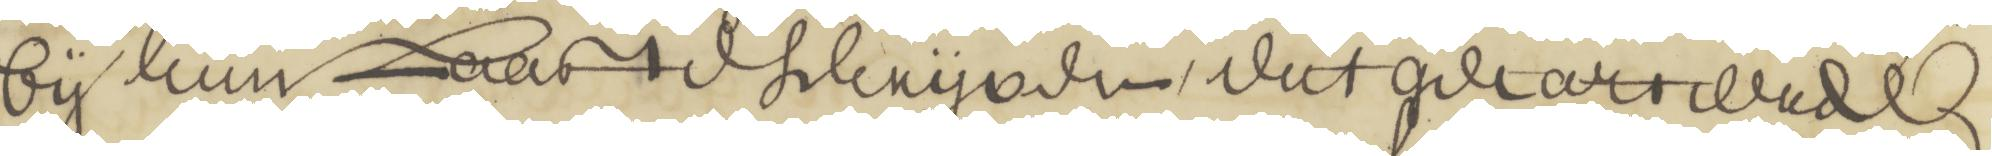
bij hun Laaste schrijven, en 't gecarteerde
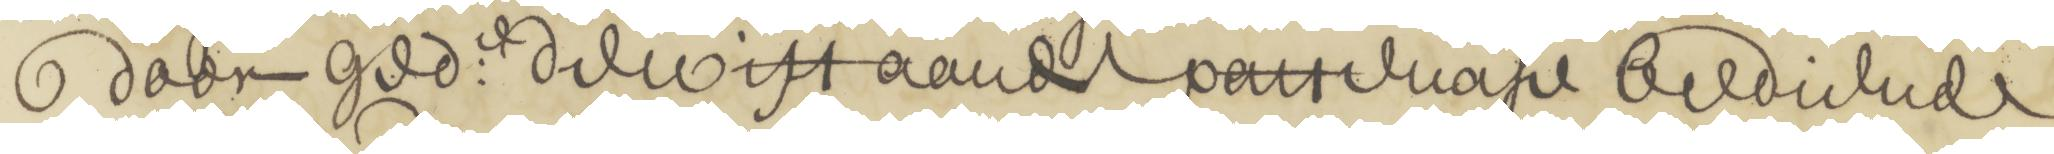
daer ged:e de witt aande pattenase bediende
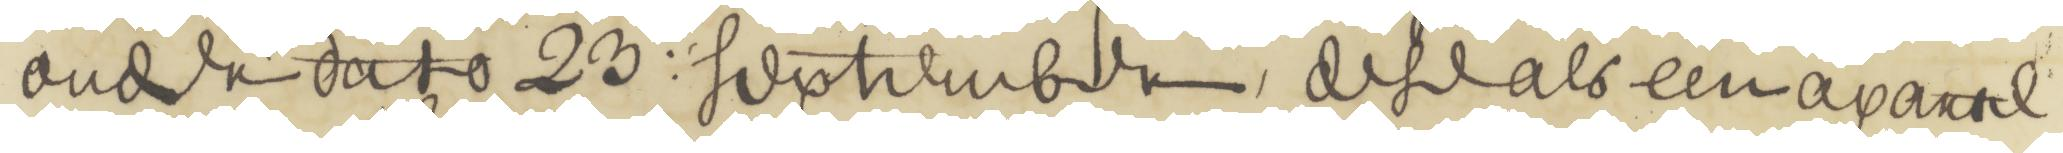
onder dato 23:' september, dese als een aparte
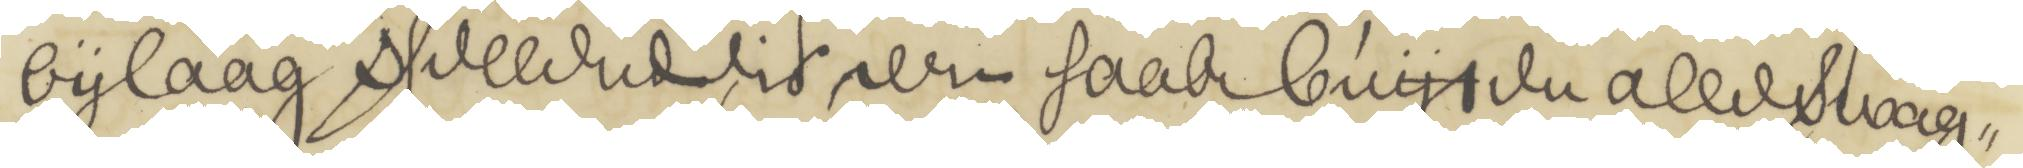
bijlaag versellende is een saak buijten alle verwag„
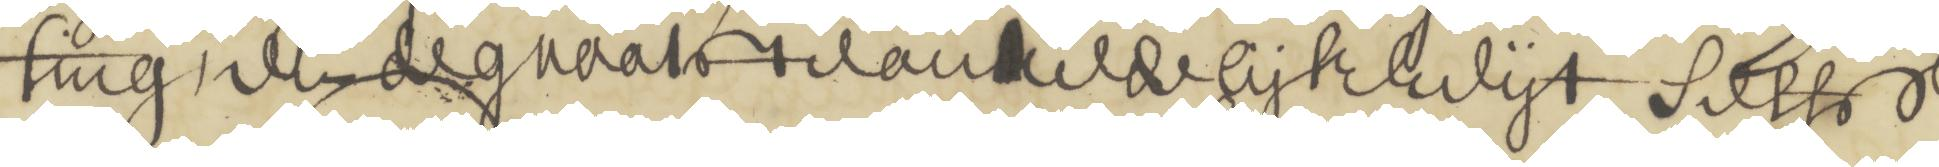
ting, en de grootste onredelijkheijt selfs
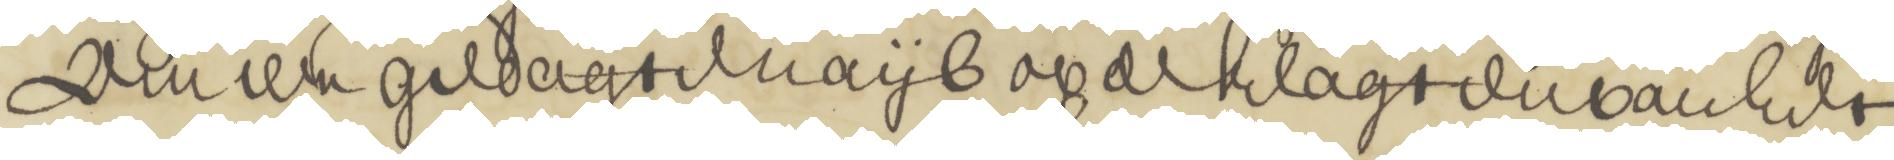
temeer gedagte naijb op de klagten van het
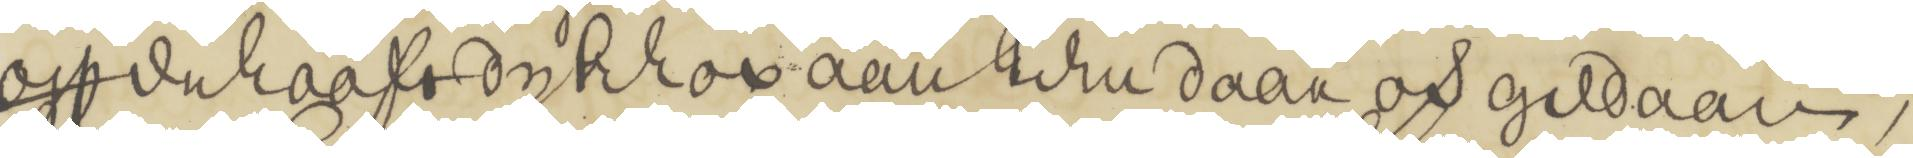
opperhooft dykhov aan hem daar over gedaan,
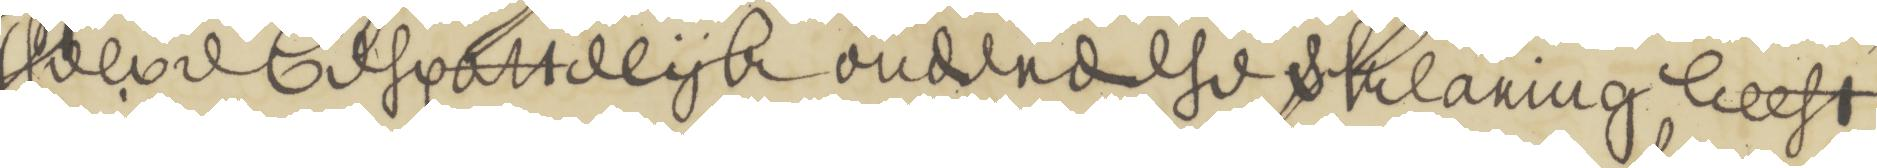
tselve bespottelijk onder dese verklaring heeft
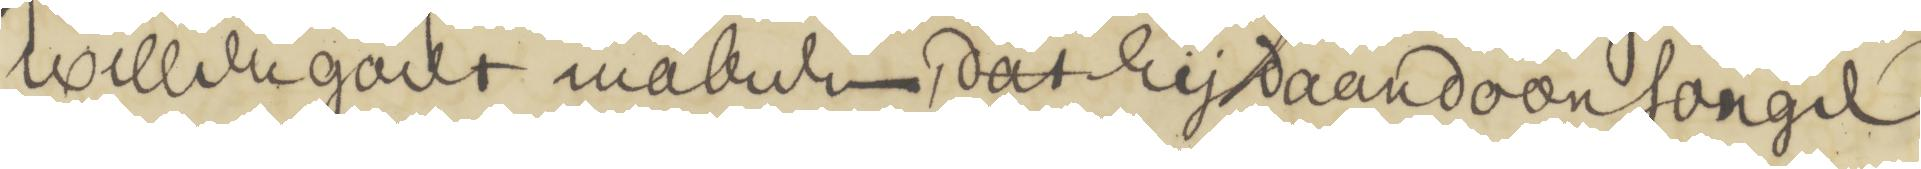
willen goet maken, dat hij daar door sorge
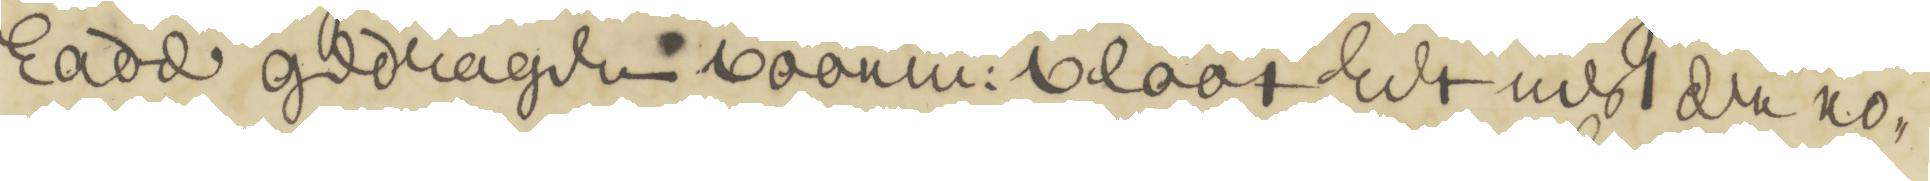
hadde gedragen voorm:te vloot het nest der ro„
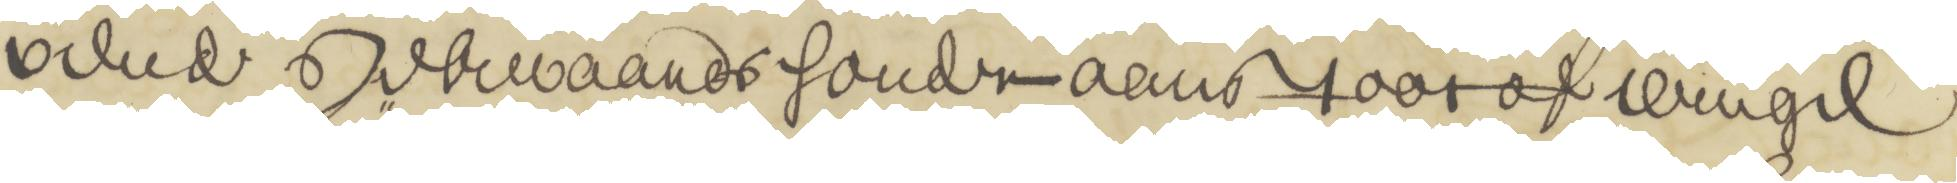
vende Jekwaards sonder aanstoot of winge
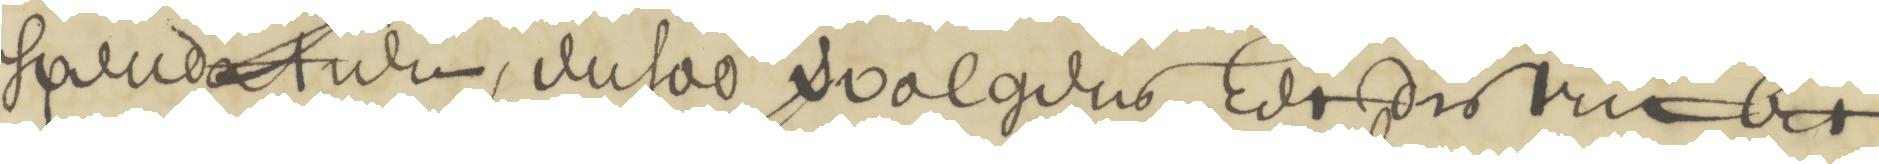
spendatien, ensoo vervolgens het districkt
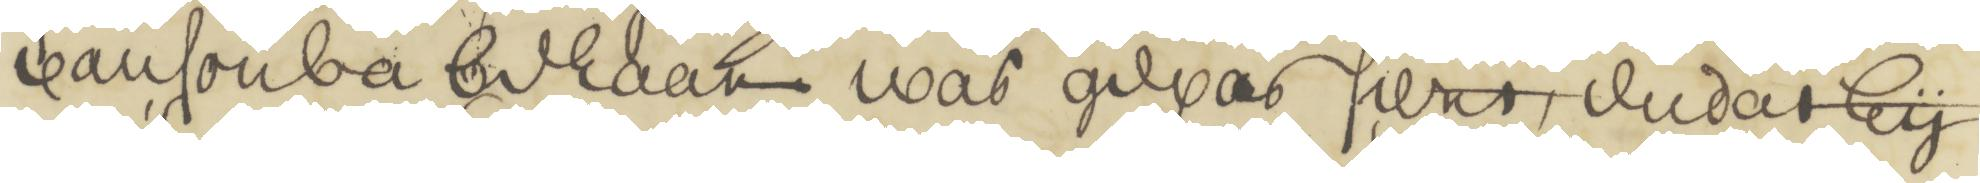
van souba behaar was gepasseert, en dat bij
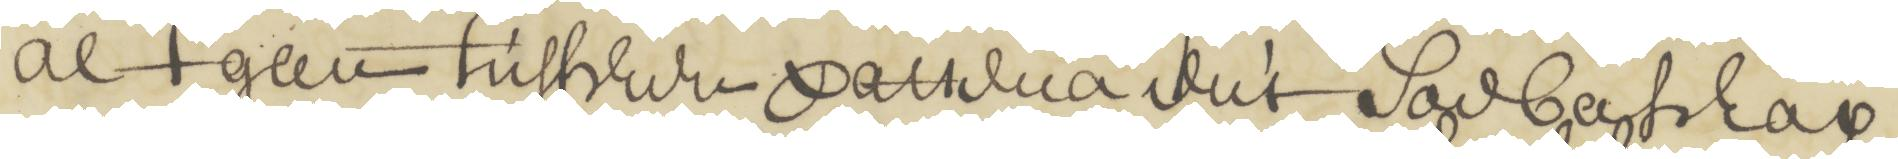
al 't geen tusschen pattena en 't Soebaschap
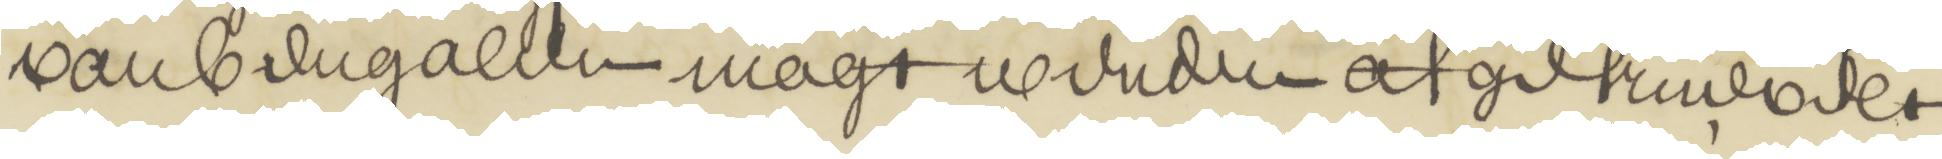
van bengalen magt werden afgeknevelt
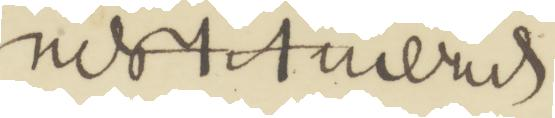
restitueeren
